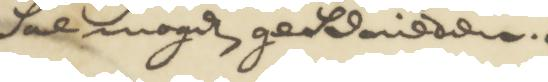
sal mogen geschieden.
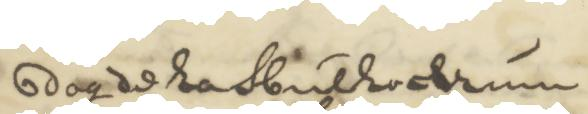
dog de hasbulhockum
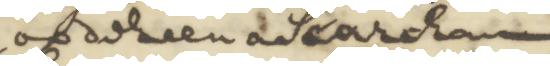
op de heer ascarchan
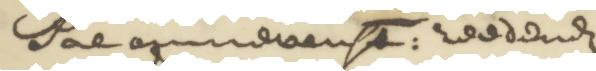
sal om nevenst: reedenen
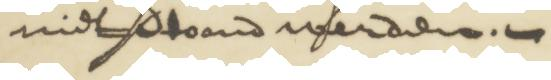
niet vertoond werden. —
